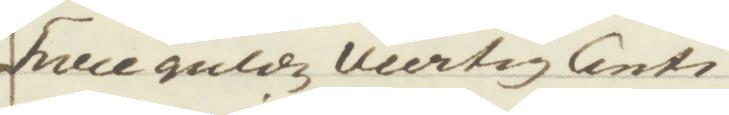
Twee gulden veertig Cents
